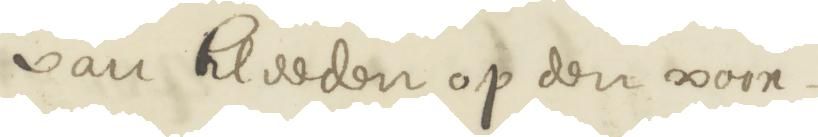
van kleeden op den voor
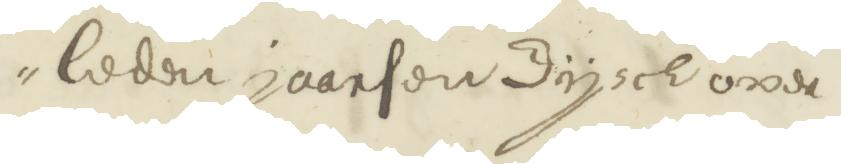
„leden jaarsen Eijsch over
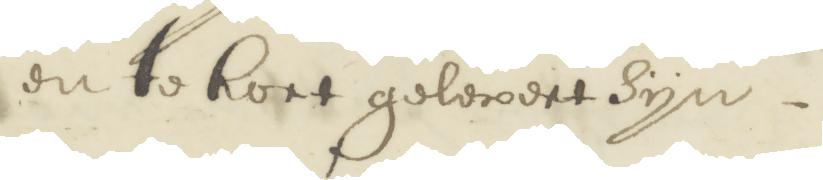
en te kort gelevert Sijn -
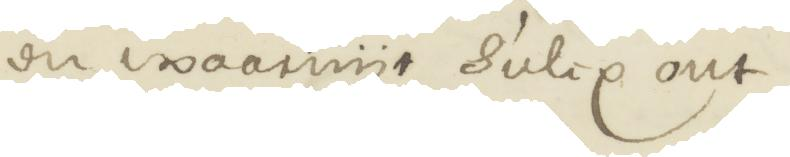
en waaruijt sulcx ont
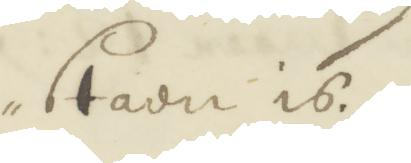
=staen is.
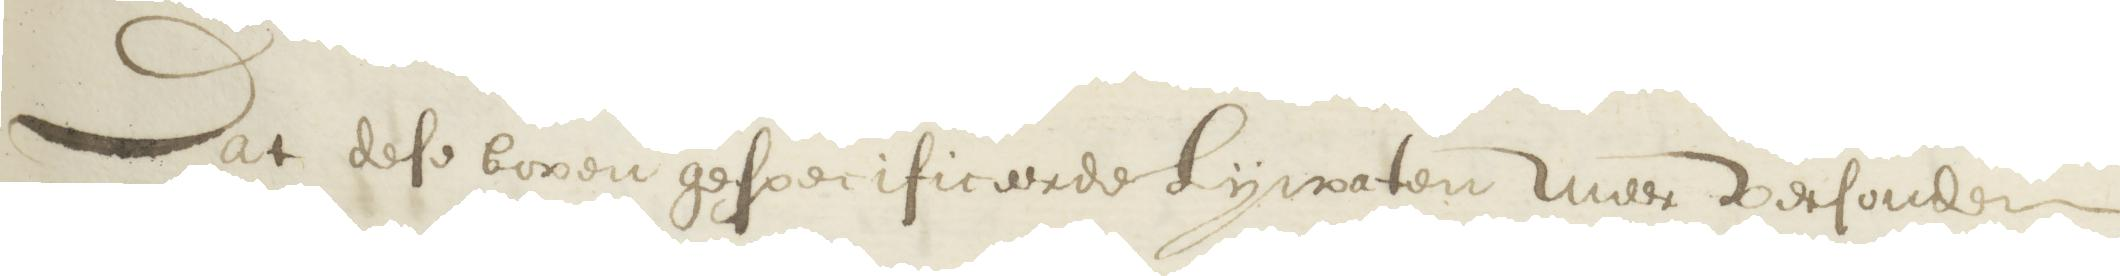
Dat dese boven gespecificeerde Lijwaten meer versonden
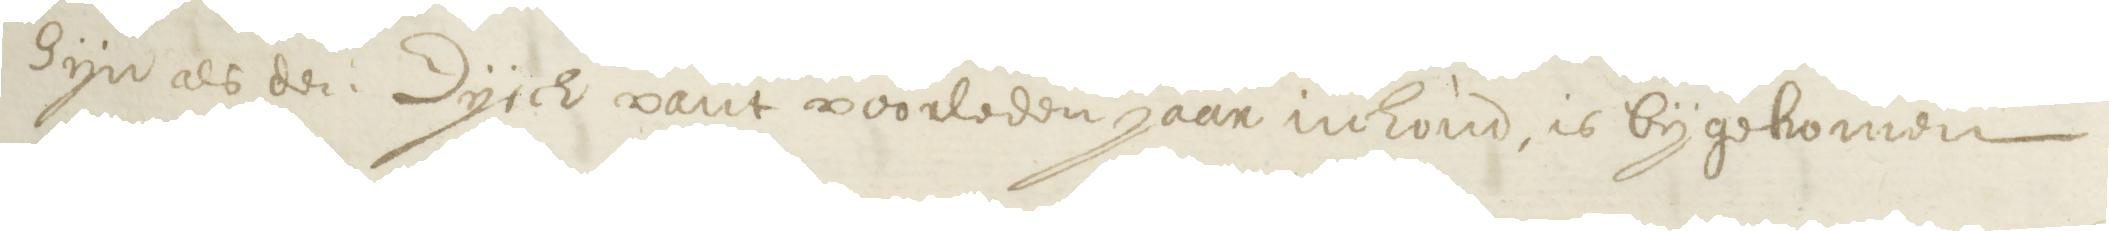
Sijn als den Eijsch vant voorleden jaar inhoud, is bij gekomen
